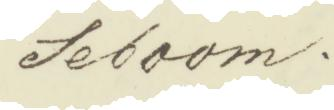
seboom.
